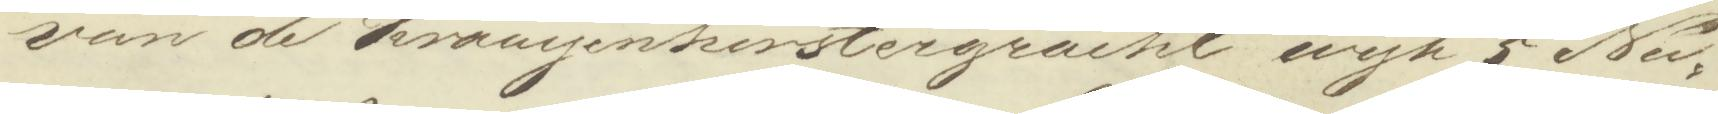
van de Kraayenhorstergracht wyk 5 Nu„
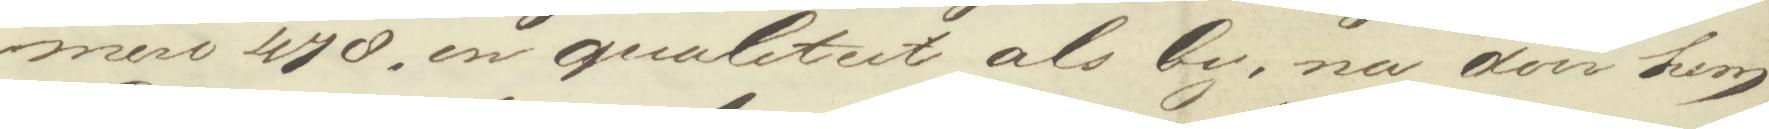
mero 478, en qualiteit als by, na door hem
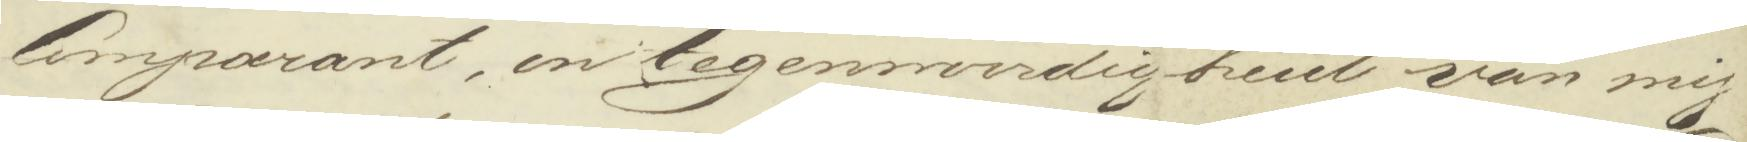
Comparant, in tegenwoordigheid van mij
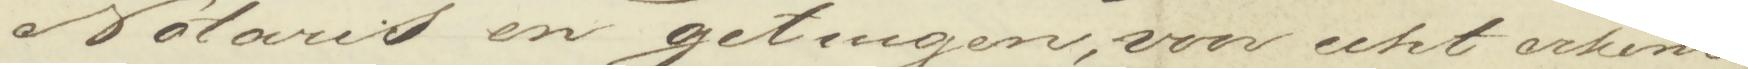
Notaris en getuigen, voor echt erkend
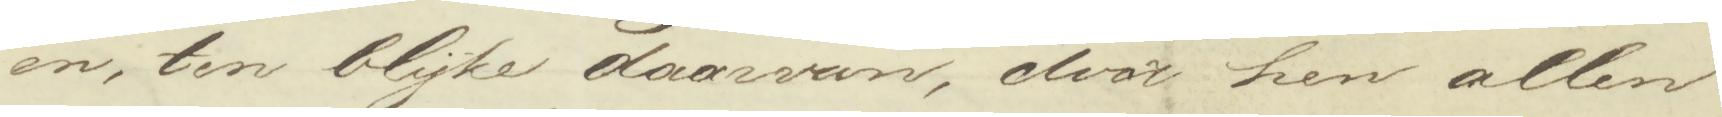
en, ten blijke daarvan, door hen allen
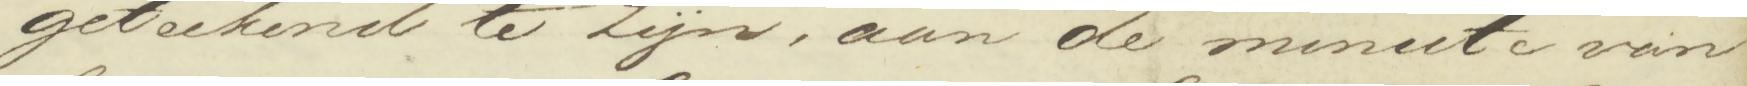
geteekend te zijn, aan de minute van
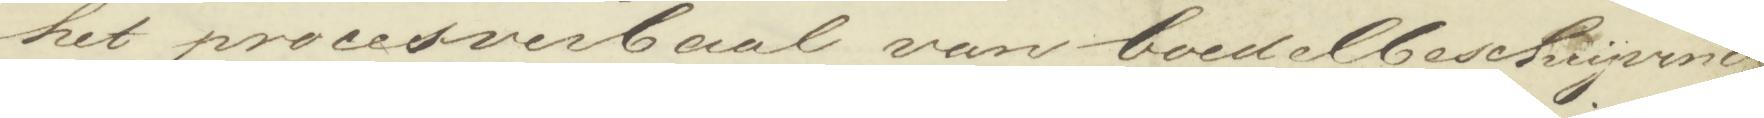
het procesverbaal van boedelbeschrijving
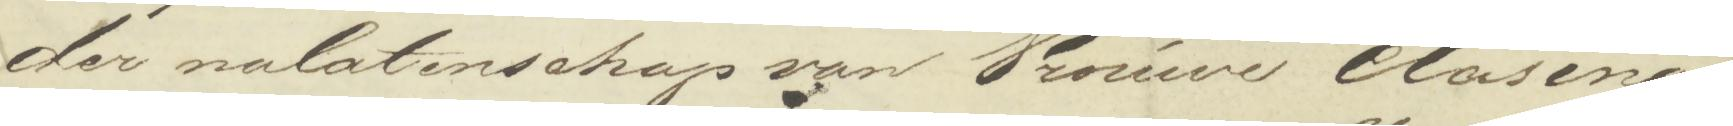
der nalatenschap van Vrouwe Clasina
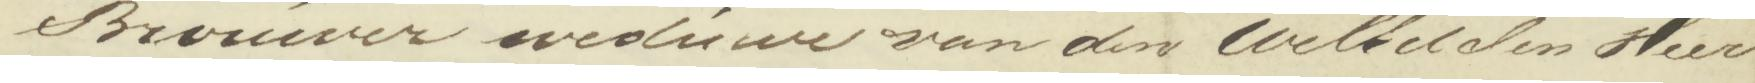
Brouwer weduwe van den Willds en Heer
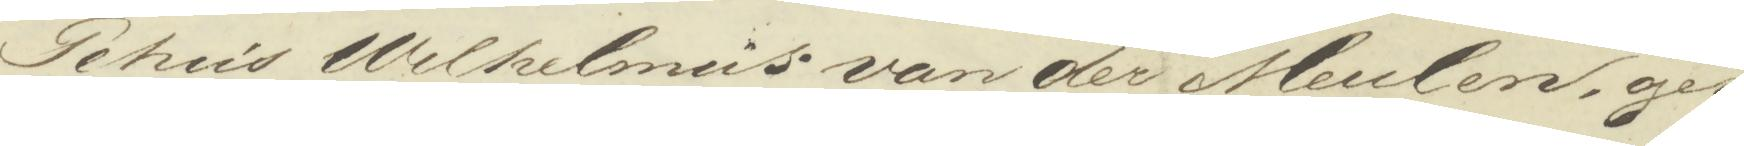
Petrus Wilhelmus van der Meulen, ge„
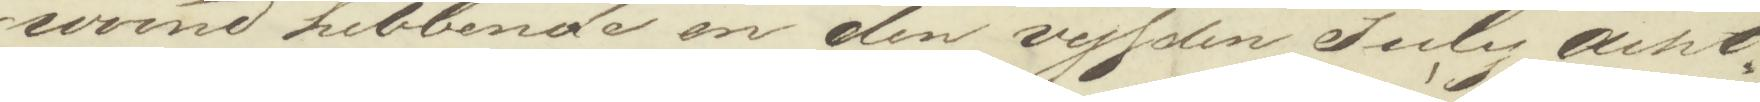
woond hebbende en den vyfden July acht
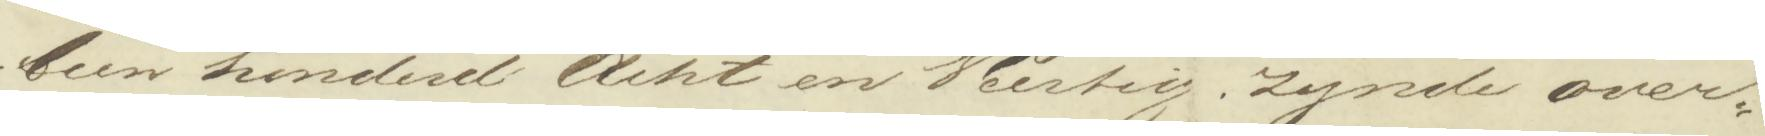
tien honderd Acht en Veertig, zynde over„
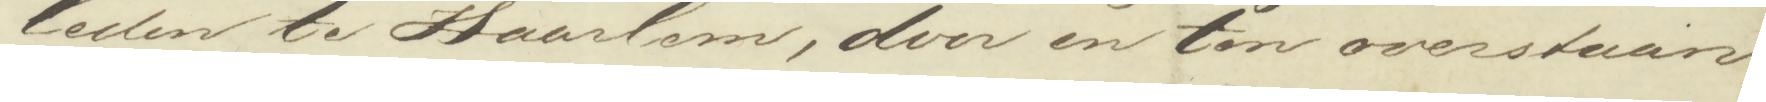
leden te Haarlem, door en ten overstaan
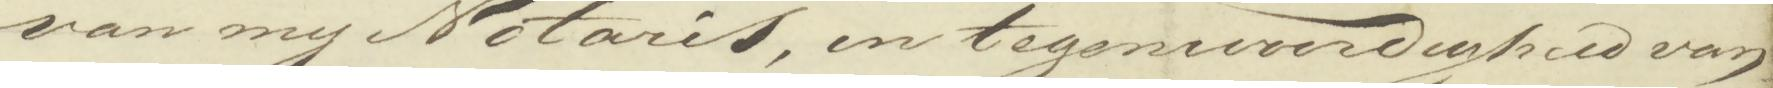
van my Notaris, in tegenwoordigheid van
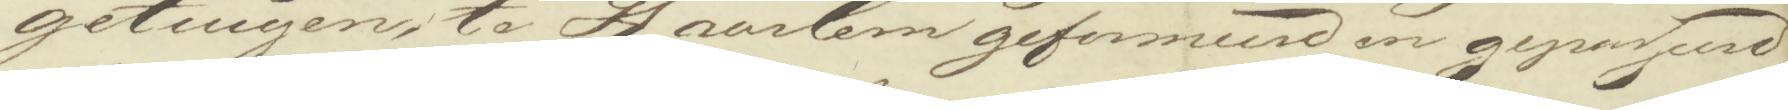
getuigen, te Haarlem geformeerd en gepasseerd-
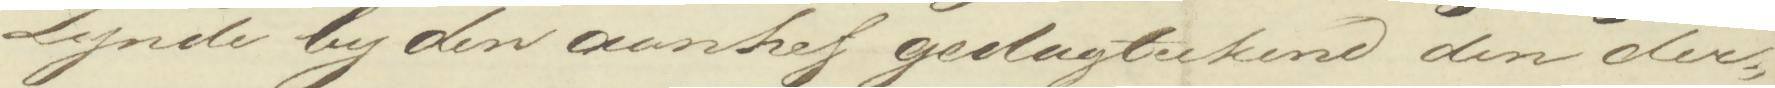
Zynde by den aanhef gedagteekend den der„
